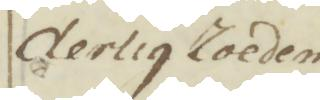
dertig roeden
